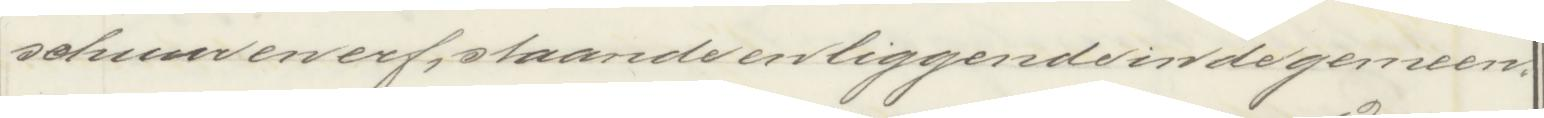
schuur en erf, staande en liggende in de gemeen„
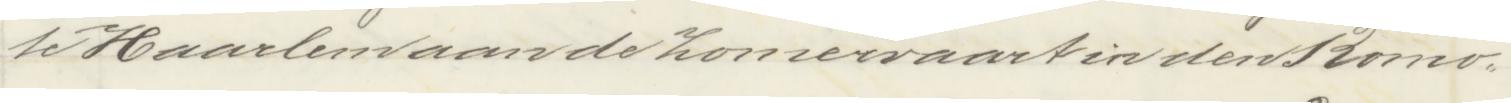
te Haarlem aan de Zomervaart in den Romo„
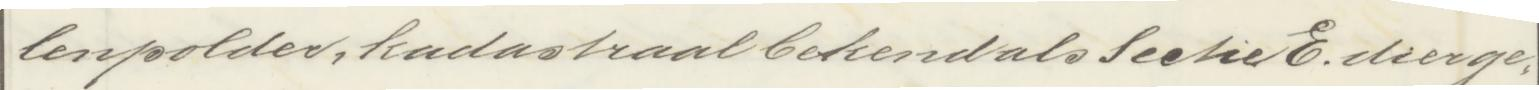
lenpolder, kadastraal bekend als sectie E. dier ge„
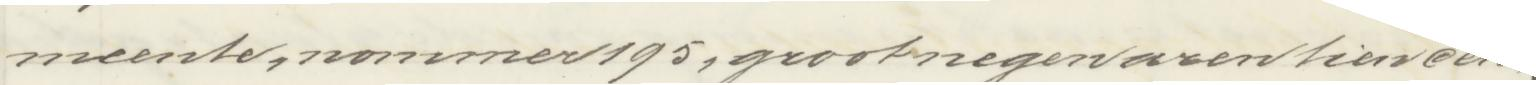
meente, nommer 195, groot negen aren tien cen„
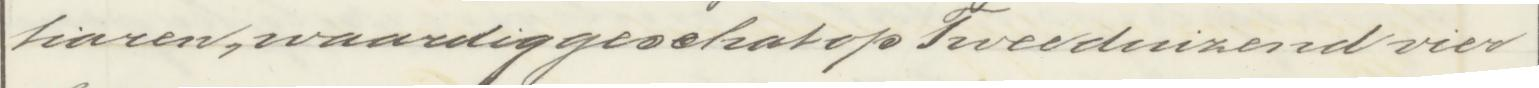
tiaren, waardig geschat op Twee duizend vier
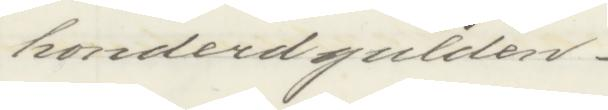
honderd gulden
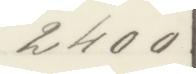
2400
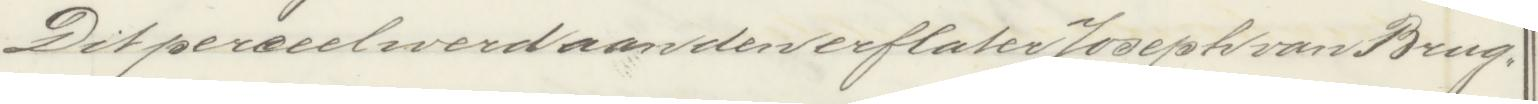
Dit perceel werd aan den erflater Joseph van Brug„
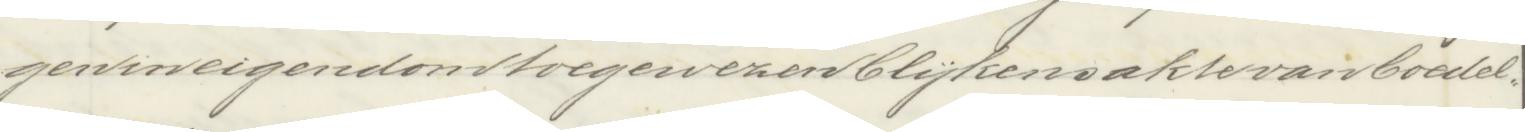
gen in eigendom toegewezen blijkens akte van boedel„
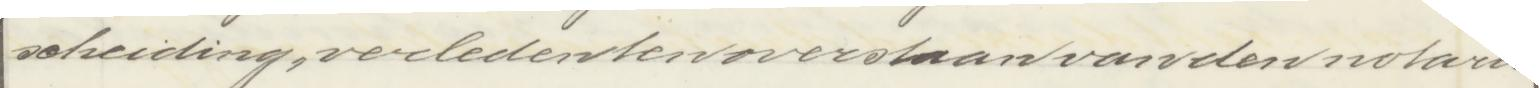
scheiding, verleden ten overstaan van den notaris
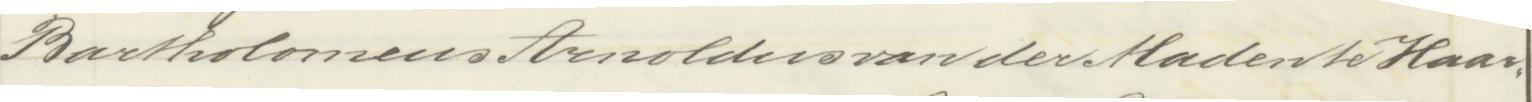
Bartholomeus Arnoldus van der Maden te Haar„
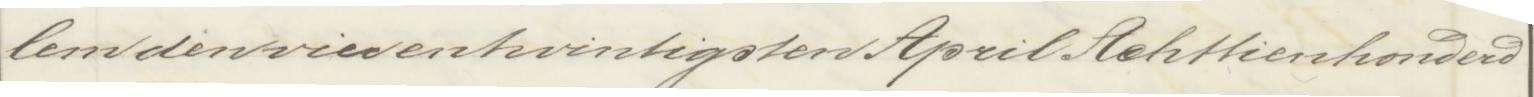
lem den vier en twintigsten April Achttienhonderd
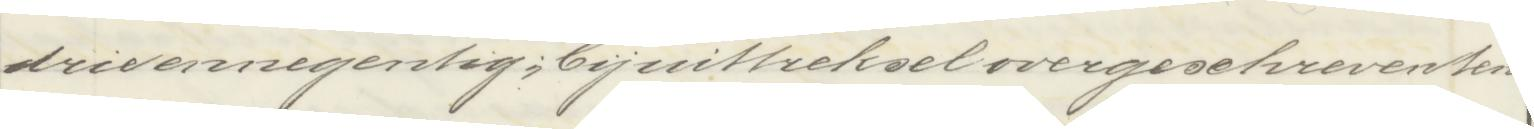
drie ennegentig; bij uittreksel overgeschreven ten
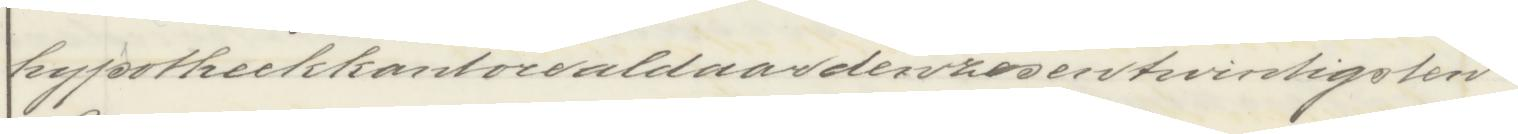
hypotheekkantore aldaar den zes en twintigsten
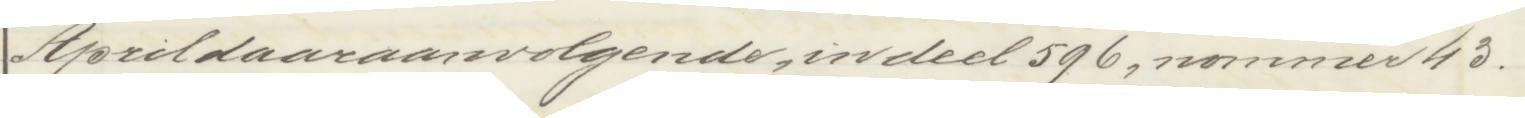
April daaraanvolgende, in deel 596, nommer 43.
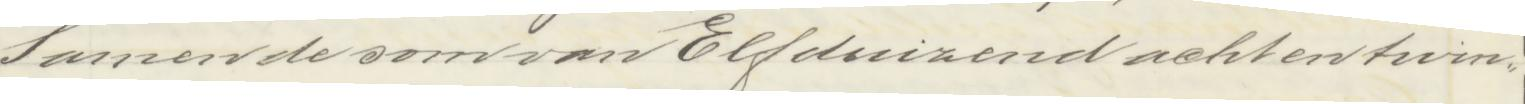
samen de som van Elf duizend acht en twin„
